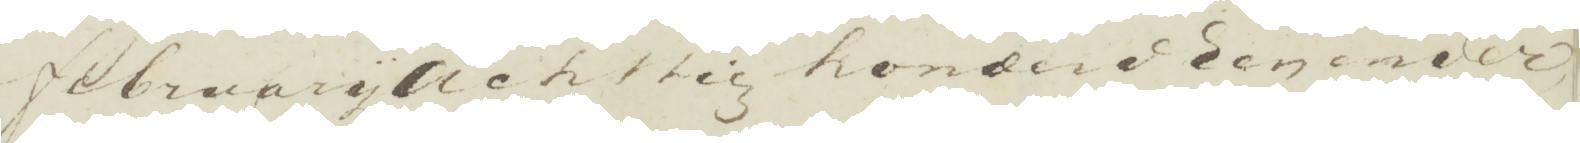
februarij Achttien honderd Een en der,
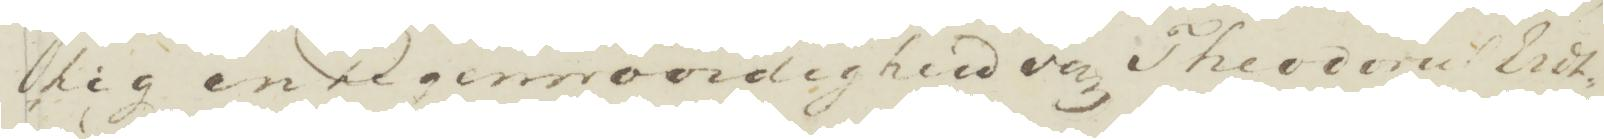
tig in tegenwoordigheid van Theodorus Erdt„
